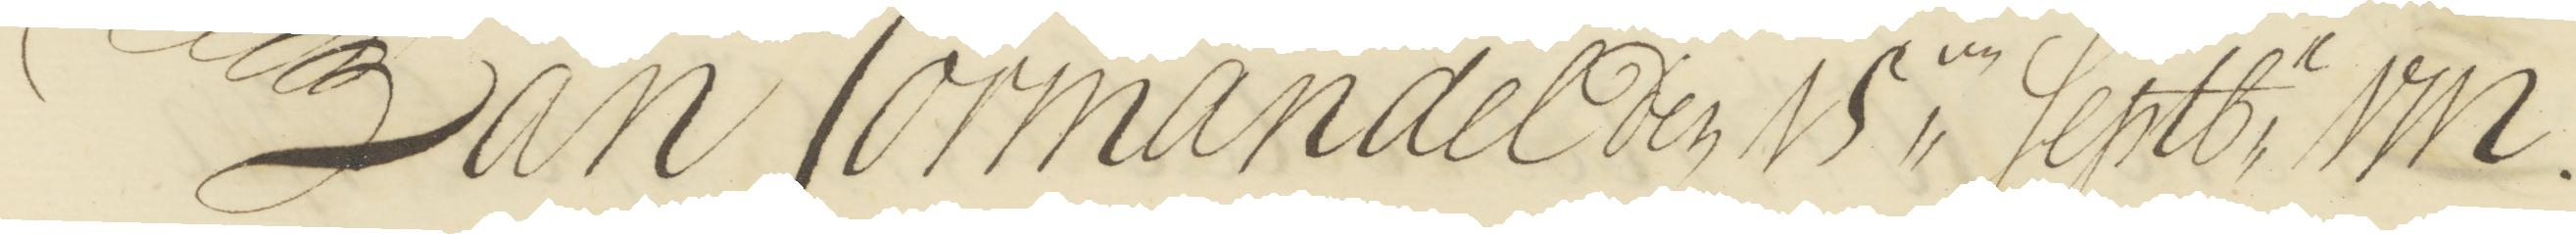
Van Cormandel den 15„en Septb„r 1712.
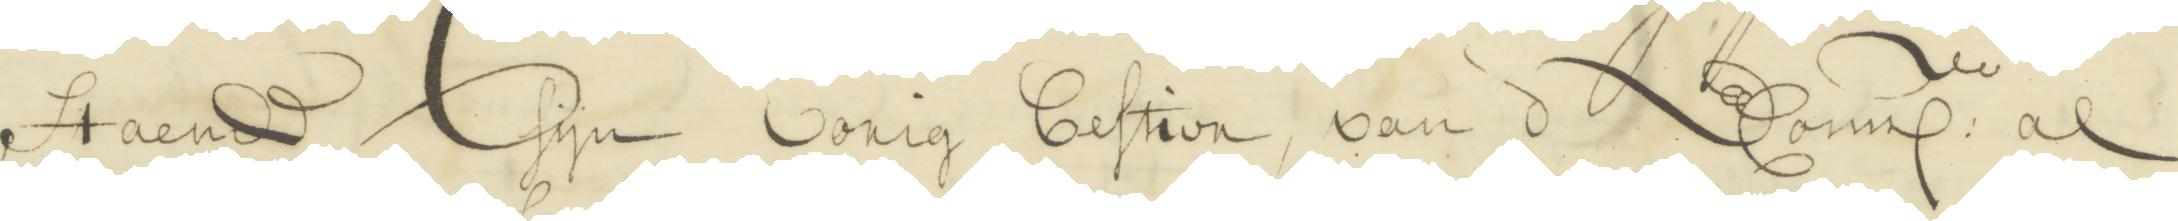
staende sijn vorig bestier, van d' EComp: al
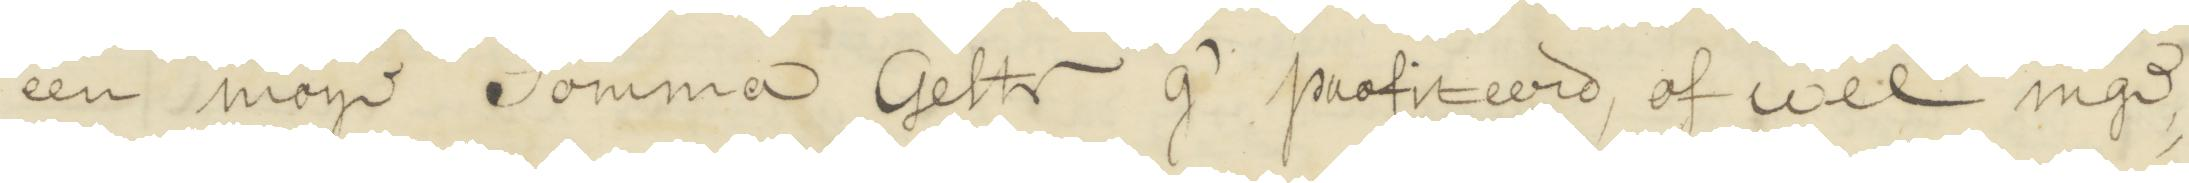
een moije somma Gelt g’ profiteerd, of wel inge„
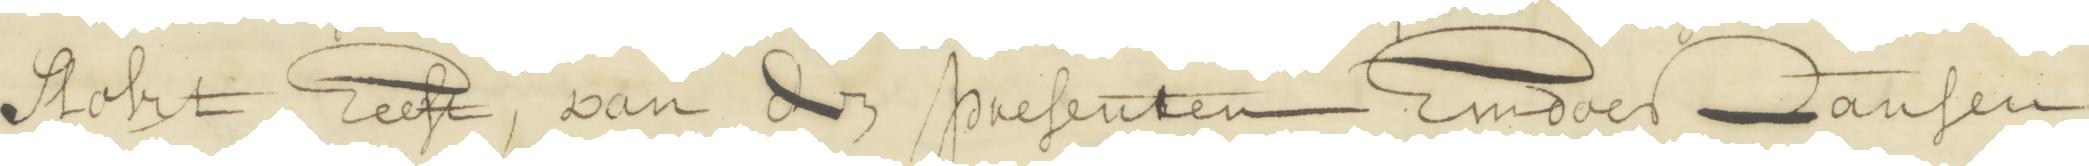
slokt heeft, van den presenten hindoestansen
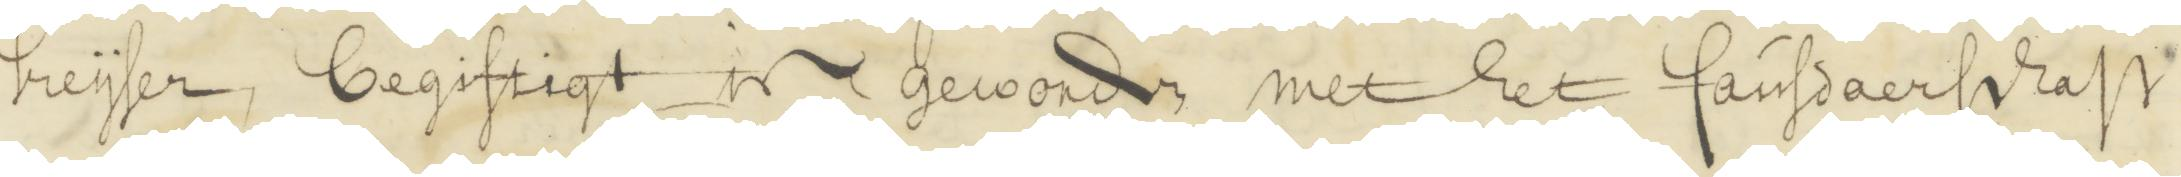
keijser, begiftigt is geworden met het fausdaerschap
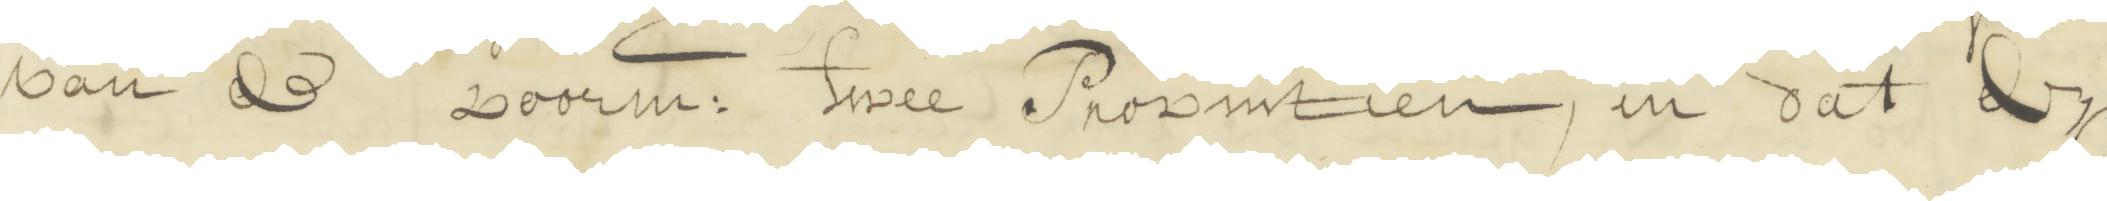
van de voorm: twee Provintien, en dat den
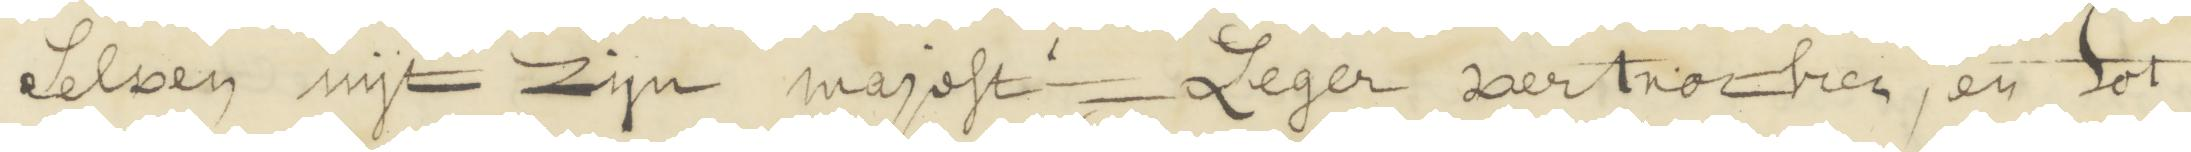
selven uijt zijn majest=' Leger vertrocken, en tot
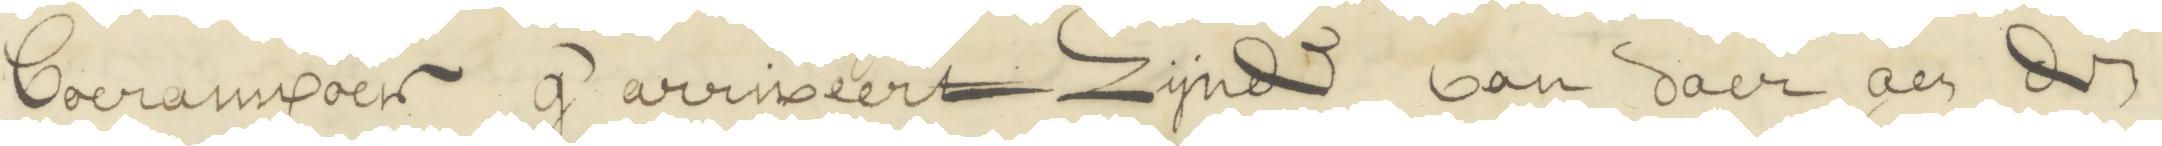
boerampoer g’ arriveert zijnde van daer aen den
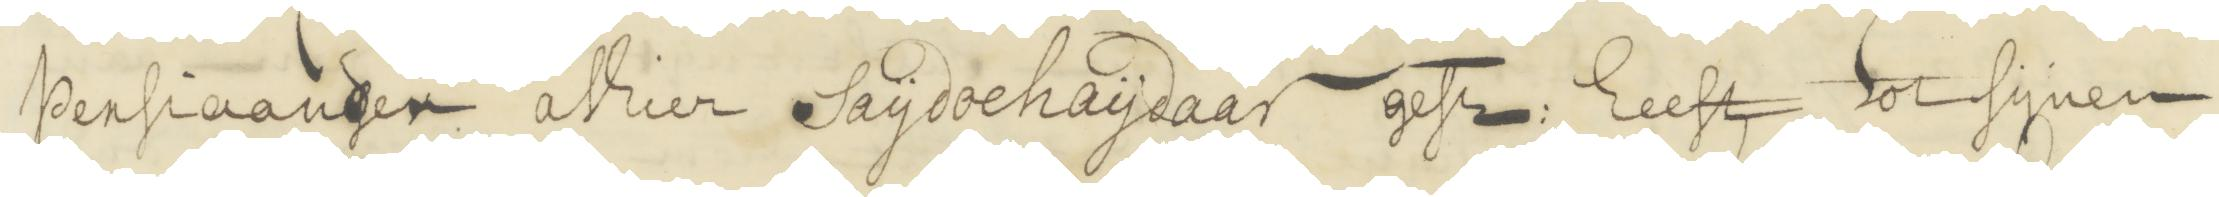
persiaander alhier saijdoekaijdaar gesz: heeft, tot sijnen
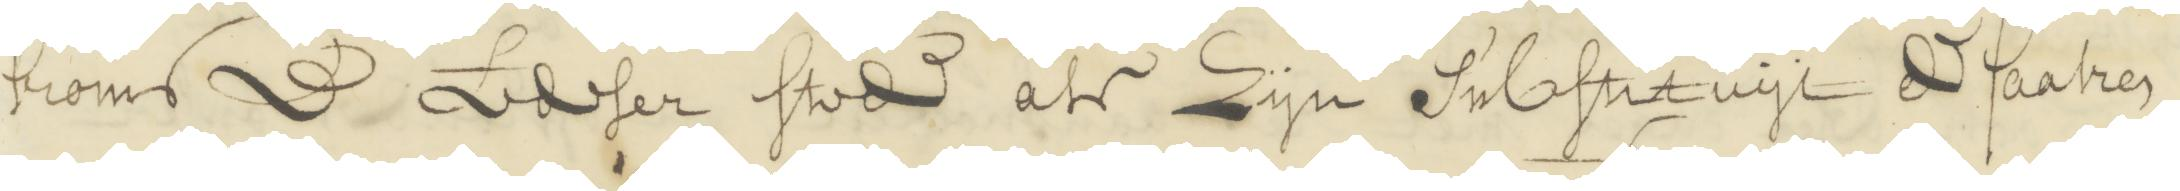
komst te deser stede als zijn substituijt de saaken
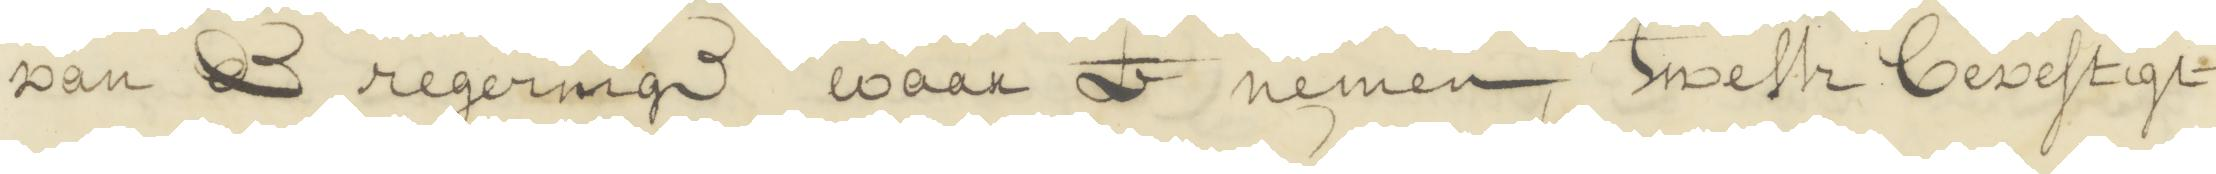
van de regeringe waar te nemen twelk bevestigt
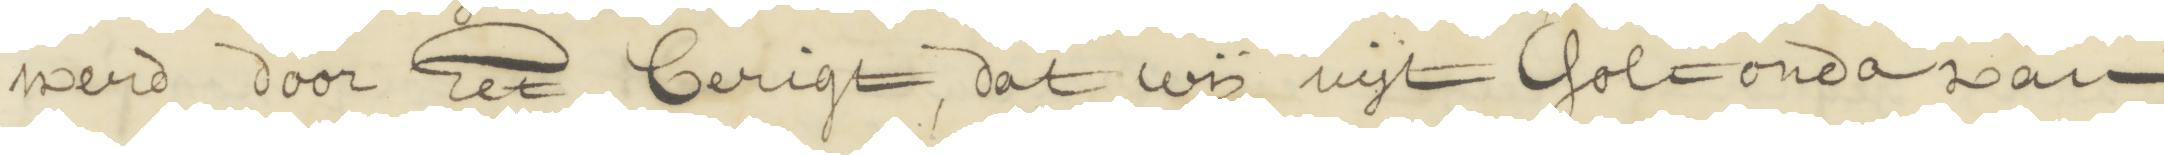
werd door het berigt, dat wij uijt Golconda van
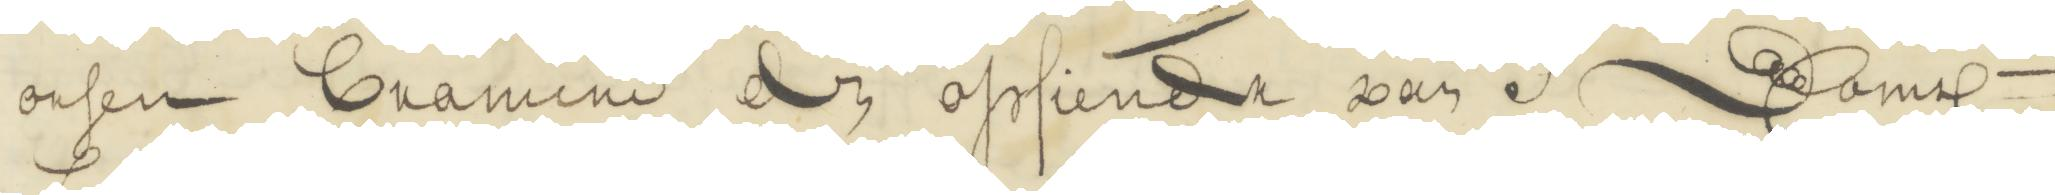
orsen bramine den opsiender van s EComp=s
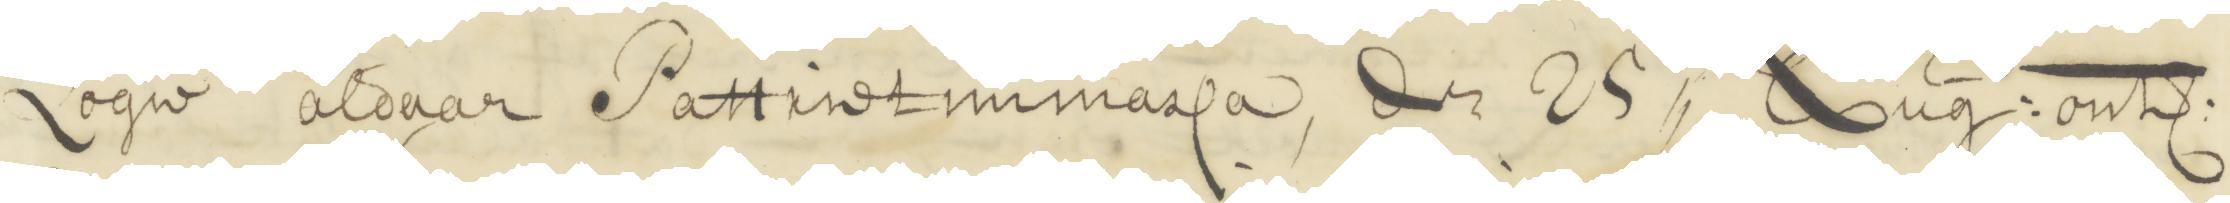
Logie aldaar Pattrietimmaspa, den 25„en Aug: ontver:
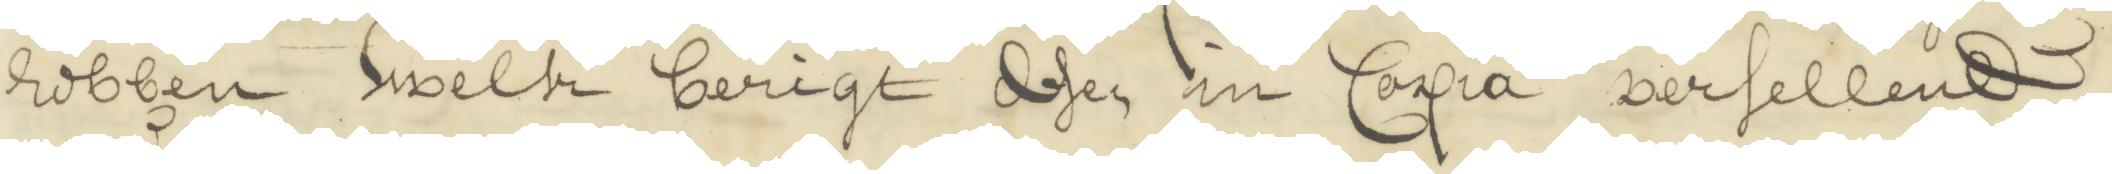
hebben twelk berigt desen in Copia versellende,
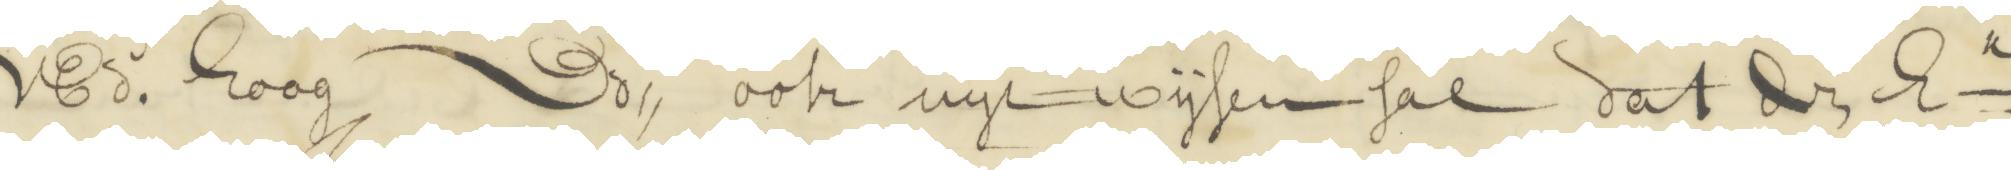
VEd.e hoog Ed„s ook uijtwijsen sal dat den h=r
